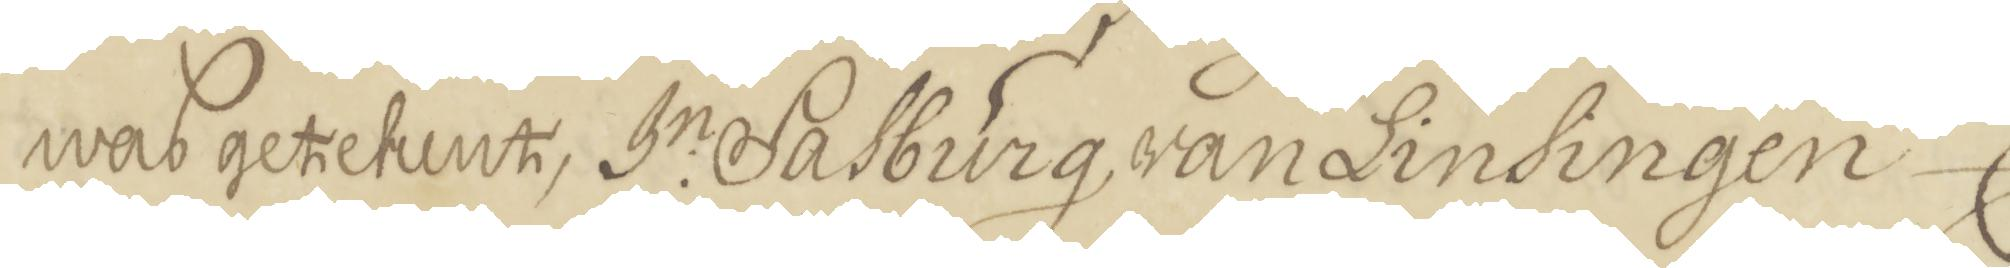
was getekent, J:n Sasburg van Linsingen
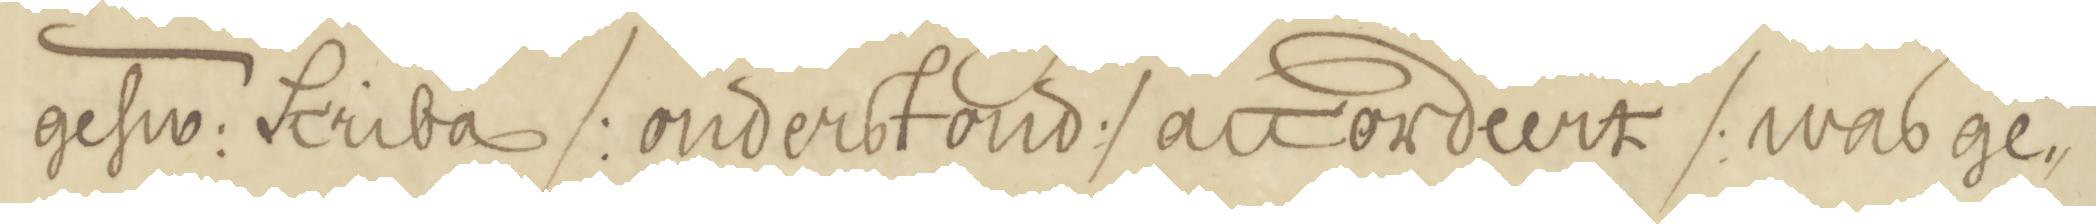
gesw: scriba /:onderstond:/ accordeert /: was ge„
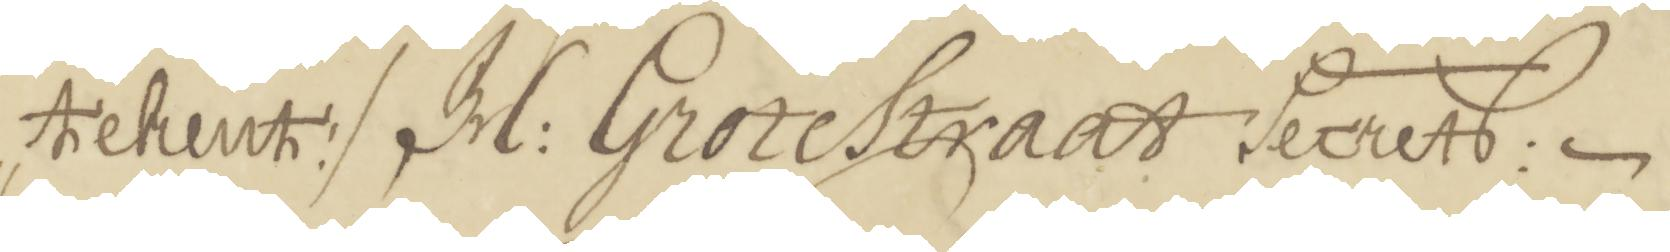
tekent:/ H: Grotestraat secrets: —
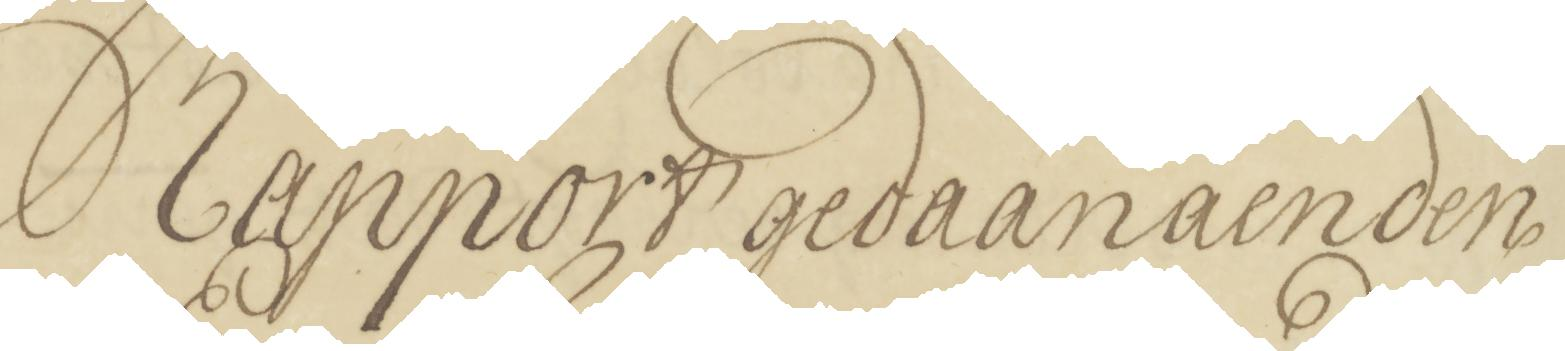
Rapport gedaan aen den
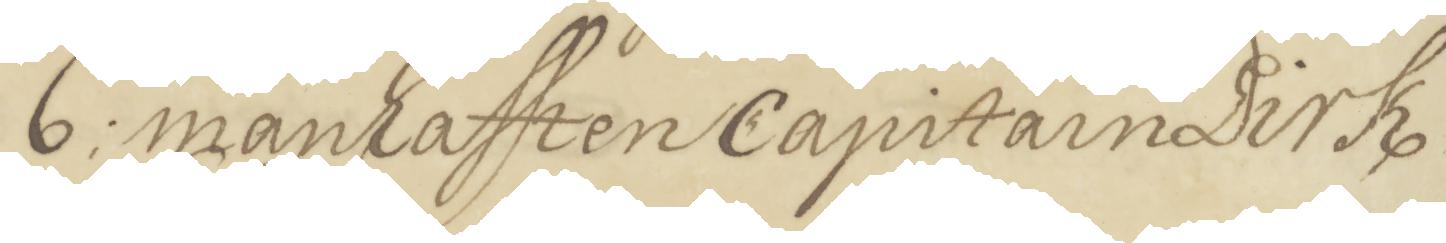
E: manhafften capitain Dirk
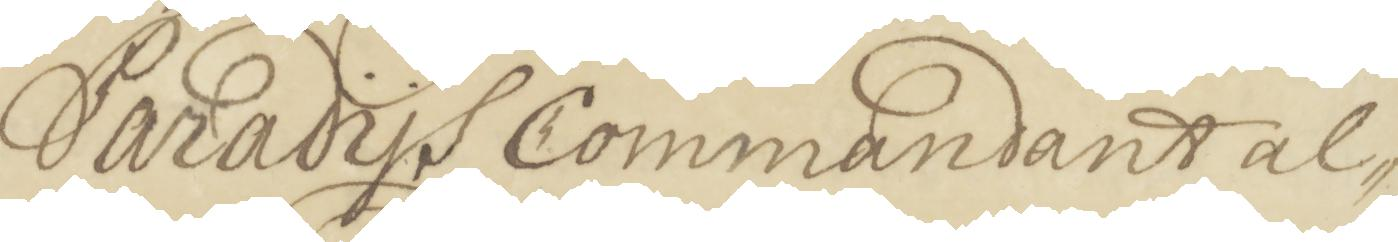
Paradijs Commandant al„
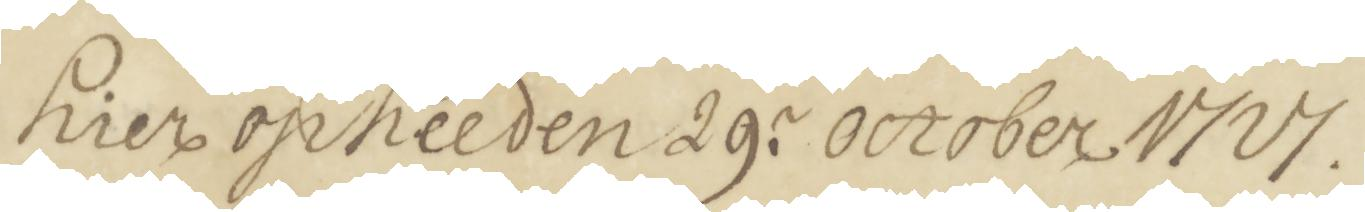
hier op heeden 29.' october 1727.
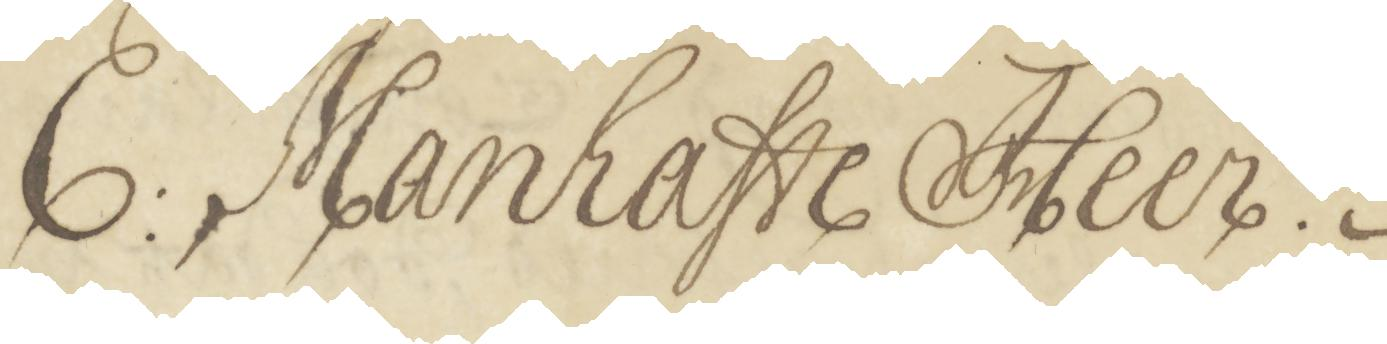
E: Manhafte Heer.
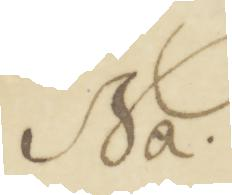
Na.
